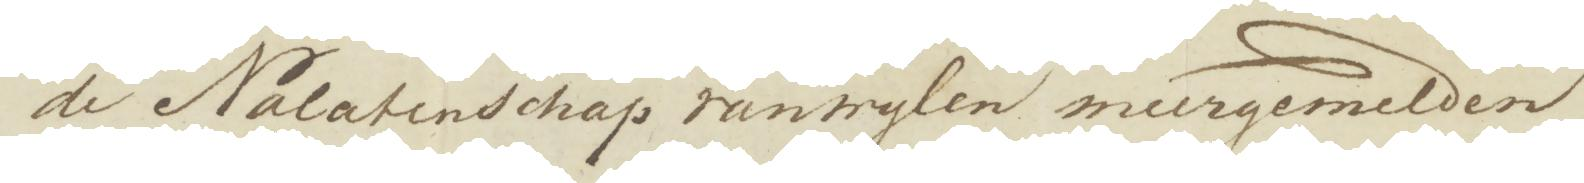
de Nalatenschap van wylen meergemelden
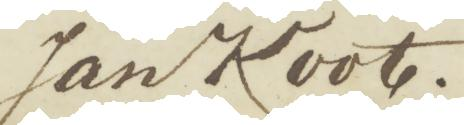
Jan Koot.
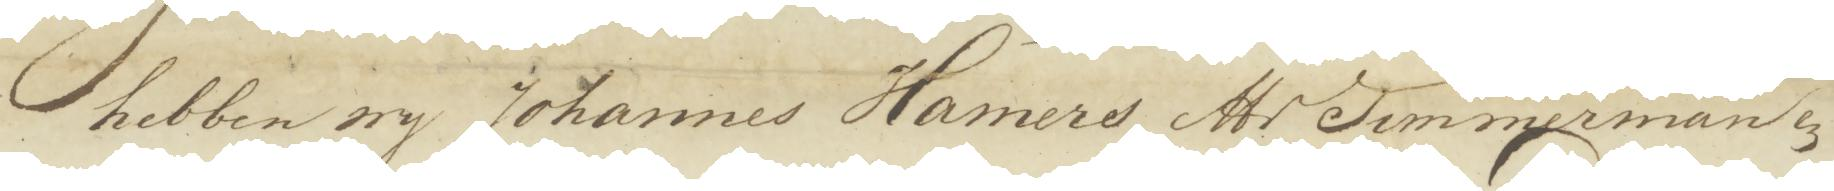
hebben wy Johannes Hamers, Ass Timmerman en
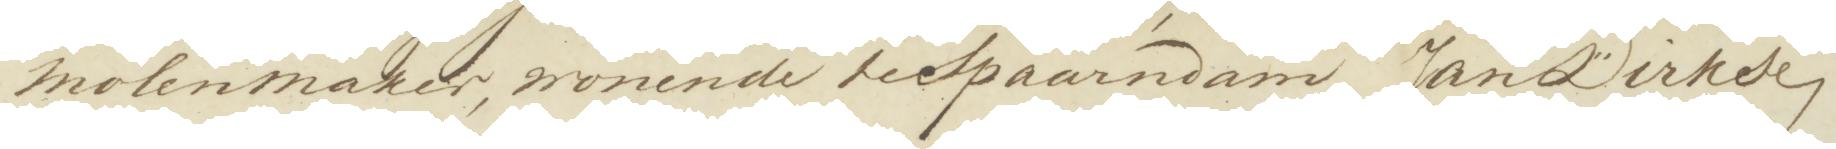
molenmaker, wonende te Spaarndam, Jan Dirksen
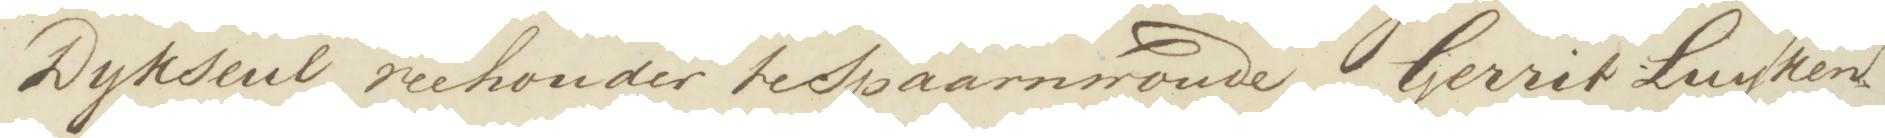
Dykseul, veehouder te Spaarnwoude, Gerrit Luyken,
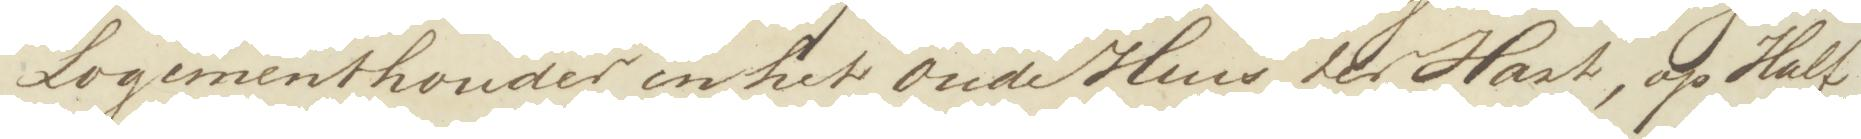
Logementhouder in het oude Huis ter Hart, op Half
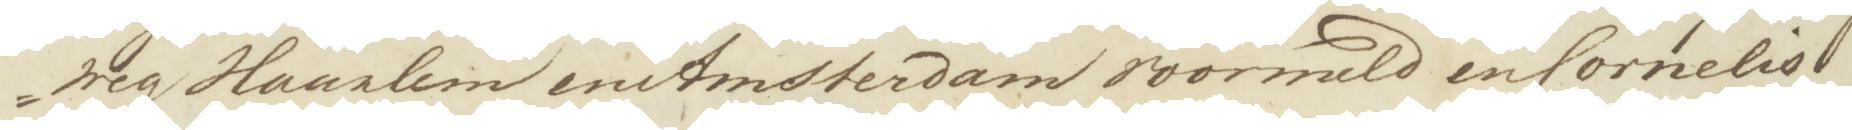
„weg Haarlem en Amsterdam voormeld en Cornelis
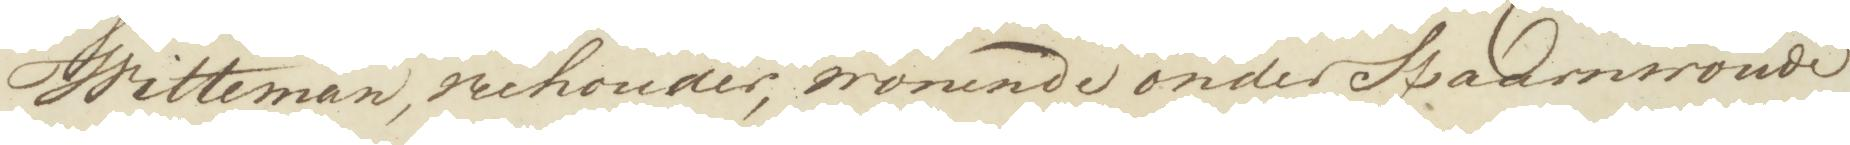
Witteman, veehouder, wonende onder Spaarnwoude
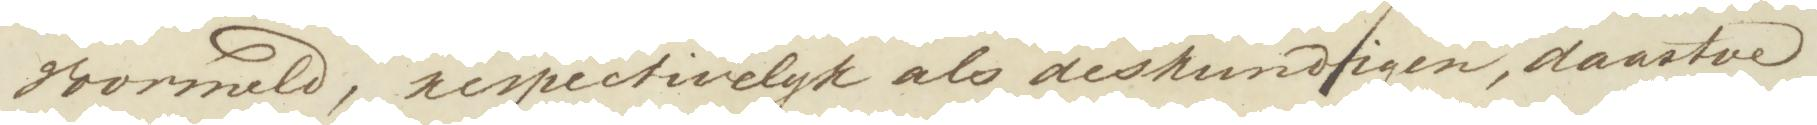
voormeld, respectivelyk als deskundigen, daartoe
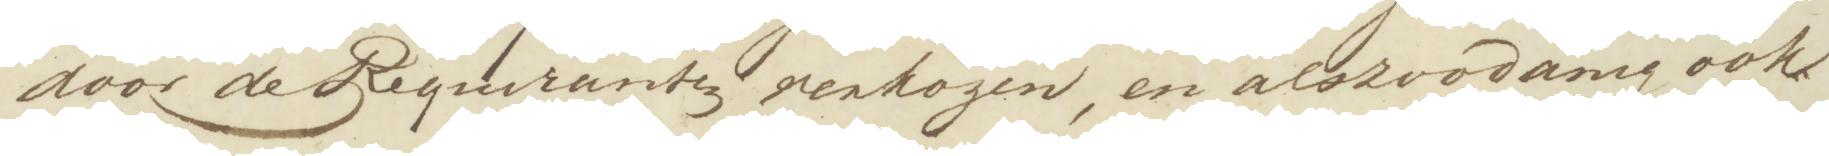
door de Requiranten verkozen, en als zoodanig ook
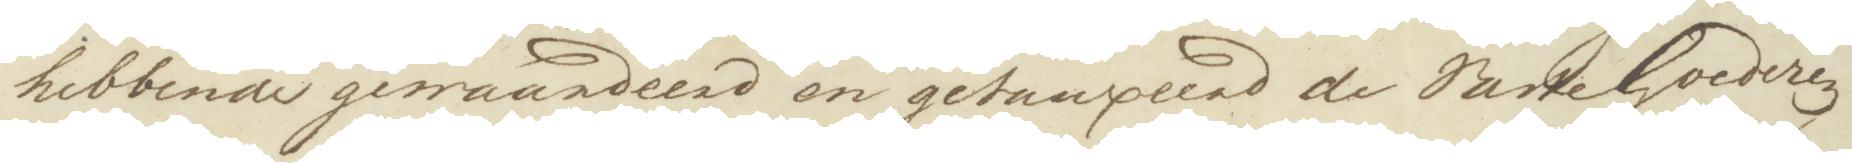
hebbende gewaardeerd en getauxeerd de Vaste Goederen
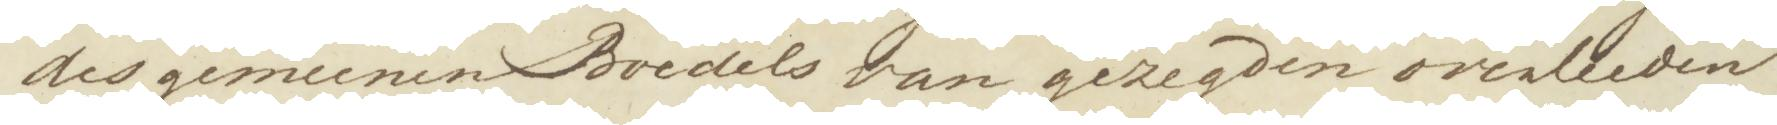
des gemeenen Boedels van gezegden overleeden
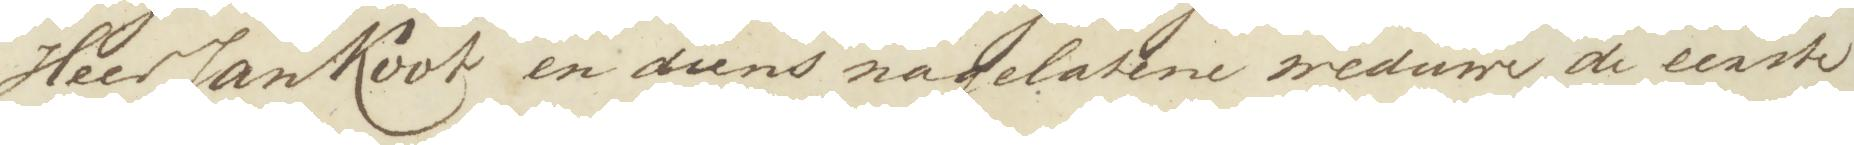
Heer Jan Koot en diens nagelatene weduwe de eerste
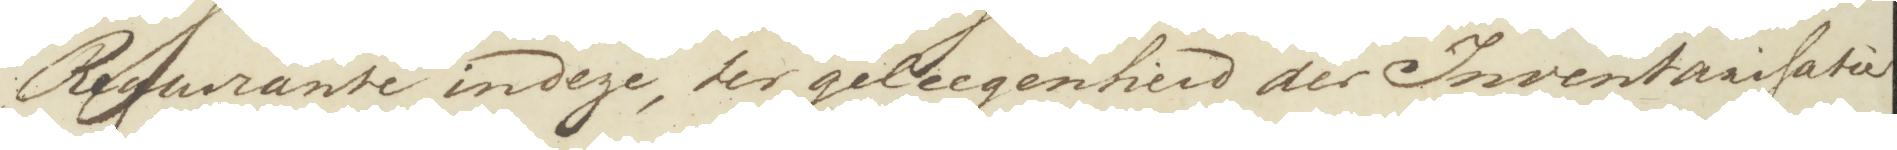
Requirante in deze, ter geleegenheid der Inventarisatie
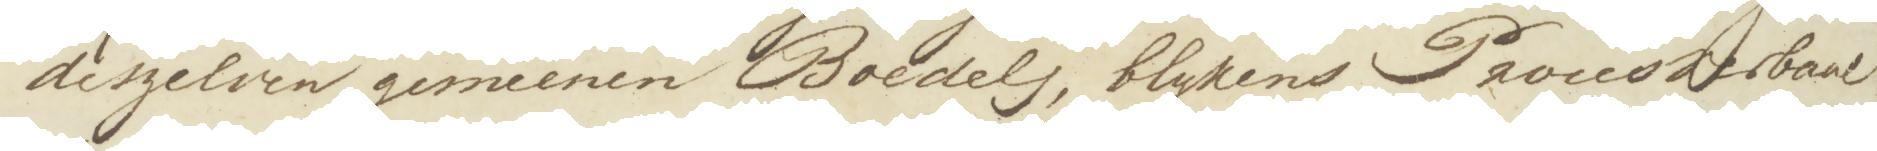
deszelven gemeenen Boedels, blykens Procesverbaal
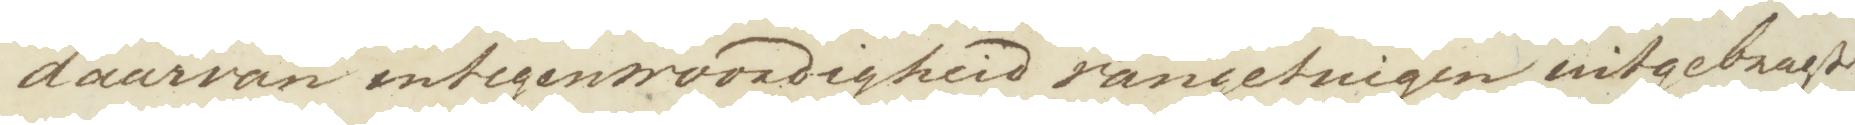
daarvan in tegenwoordigheid van getuigen uitgebragt
